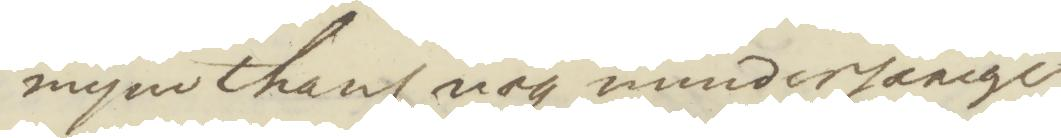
myne thans nog minderjarige
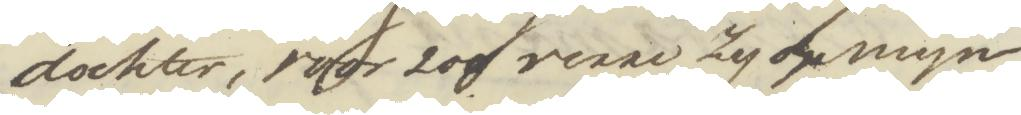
dochter, voor zoo verre zy op myn
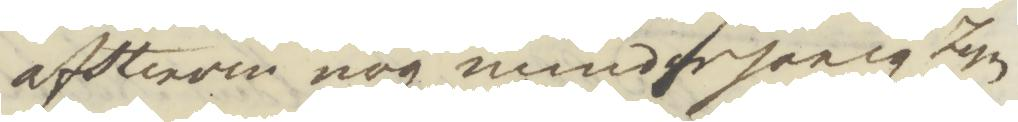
afsterven nog minderjarig zyn
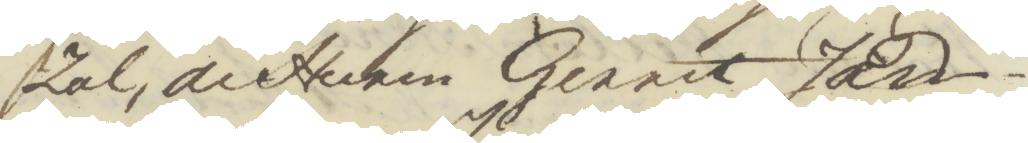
zal, de Heeren Gerrit Jan
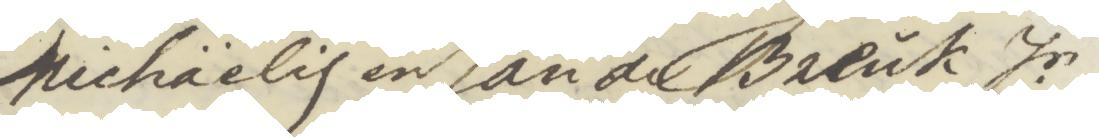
Michäelis en Jan de Breuk J.r
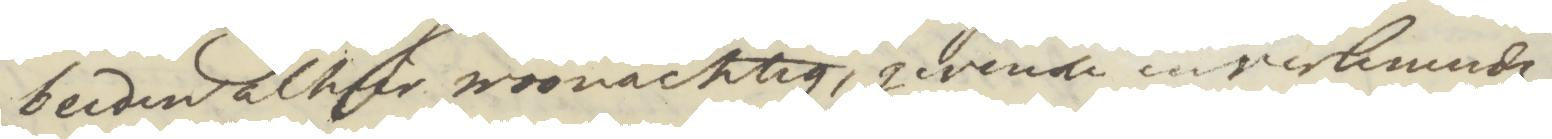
beiden alhier woonachtig, gevende en verlenende
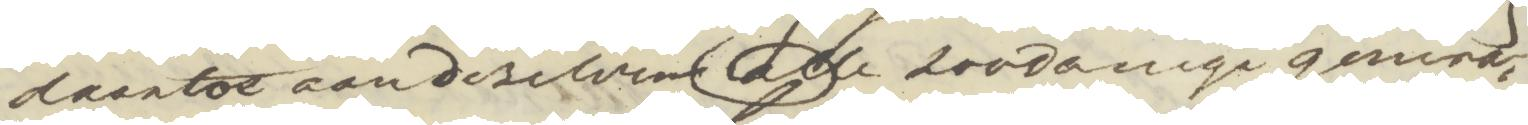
daartoe aan dezelver alle zoodanige genera„
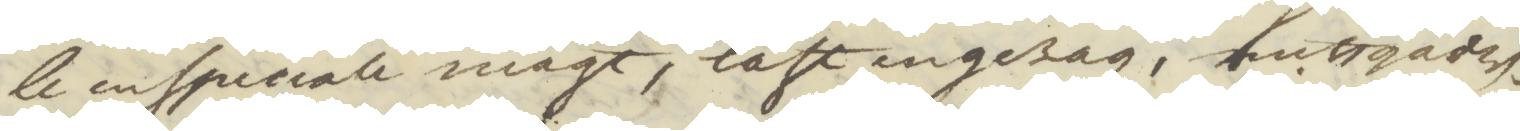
le en speciale magt, last en gezag, mitsgaders
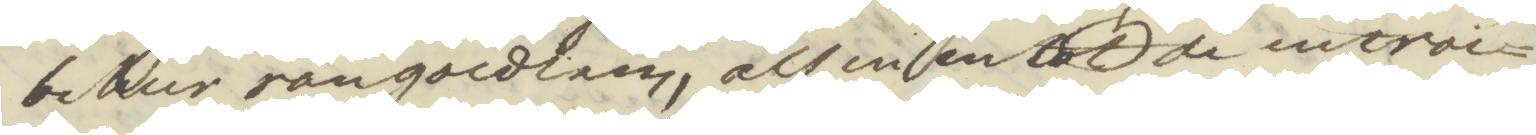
beheer van goederen, als in en tot de uitvoe„
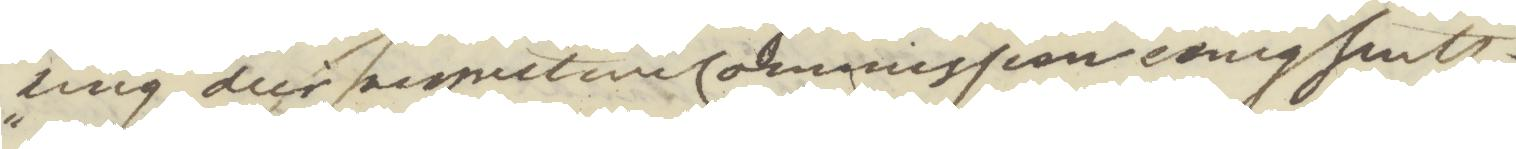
ring dier respective Commissien eenigsintz
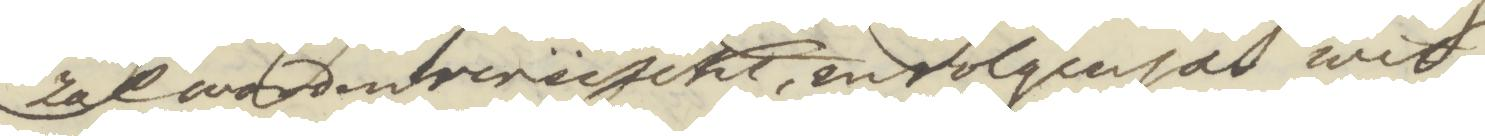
zal worden vereischt, en volgen ja wie,
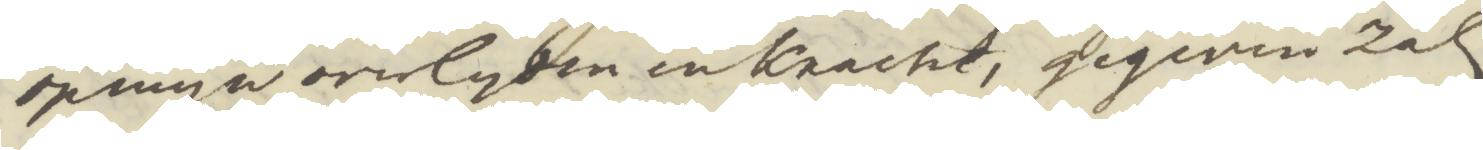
op myn overlyden en kracht, gegeven zal
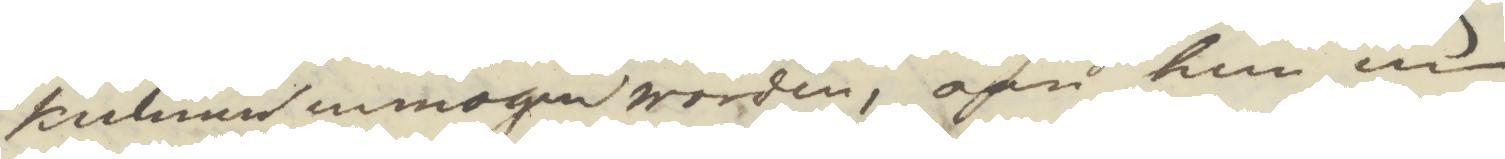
kunnen en mogen worden, aan hen in
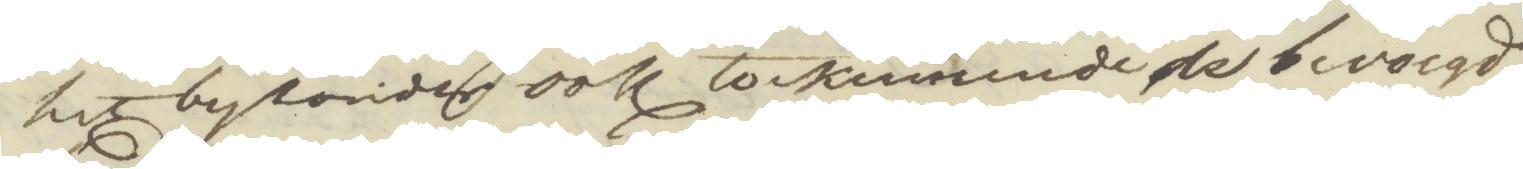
het bysonder ook toekennende de bevoegd
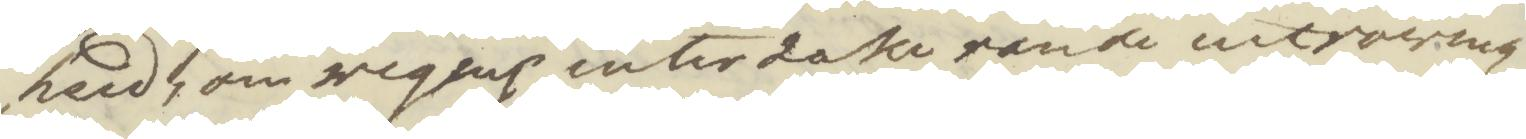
heid, om wegens en ter zake van de uitvoering
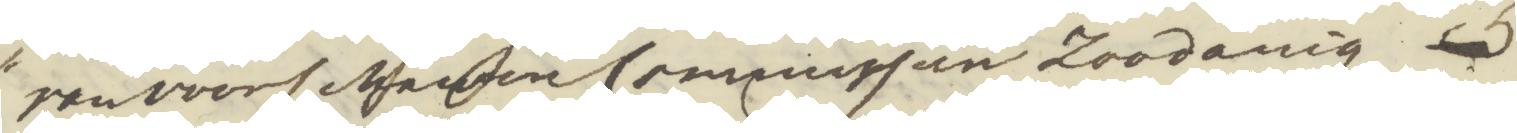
van voorschreven Commissien zoodanig
